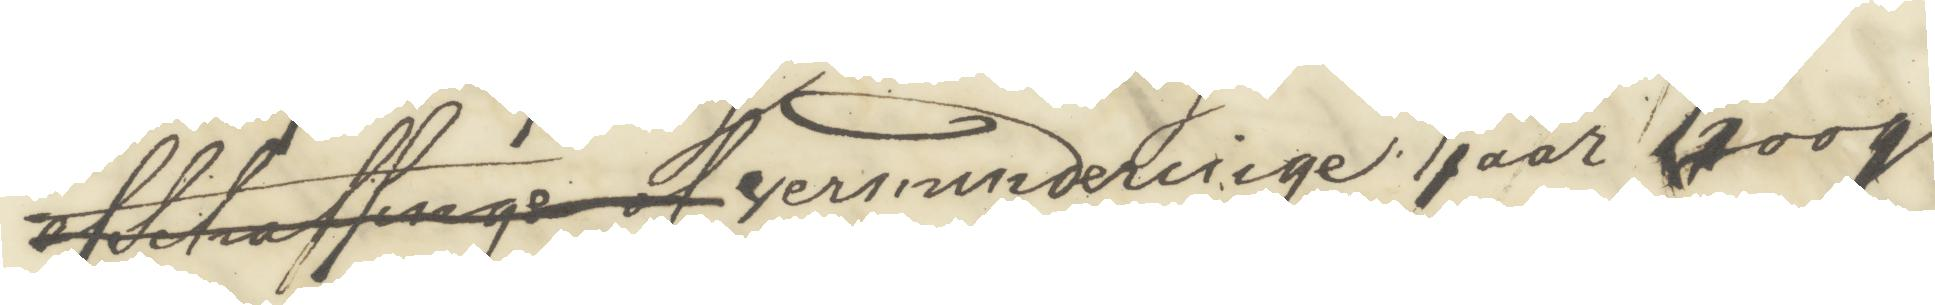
afschaffinge of verminderinge haar hoog
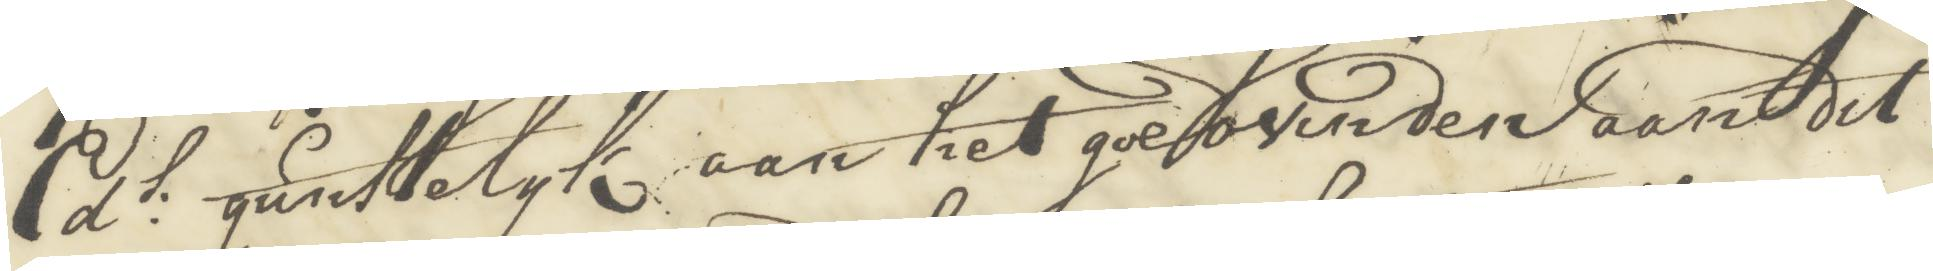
Ed:s gunstelyk aan het goedvinden aan dit
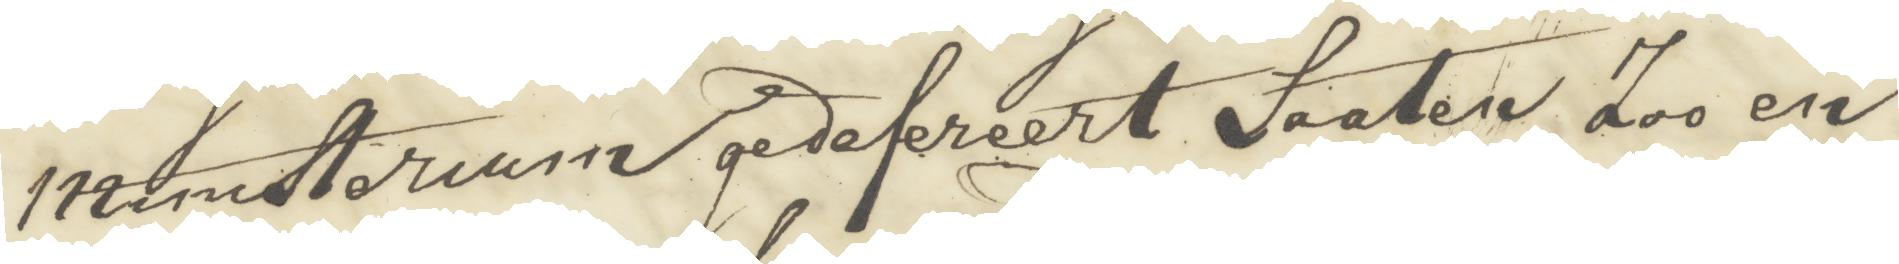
ministerium gedefereert laaten zoo en
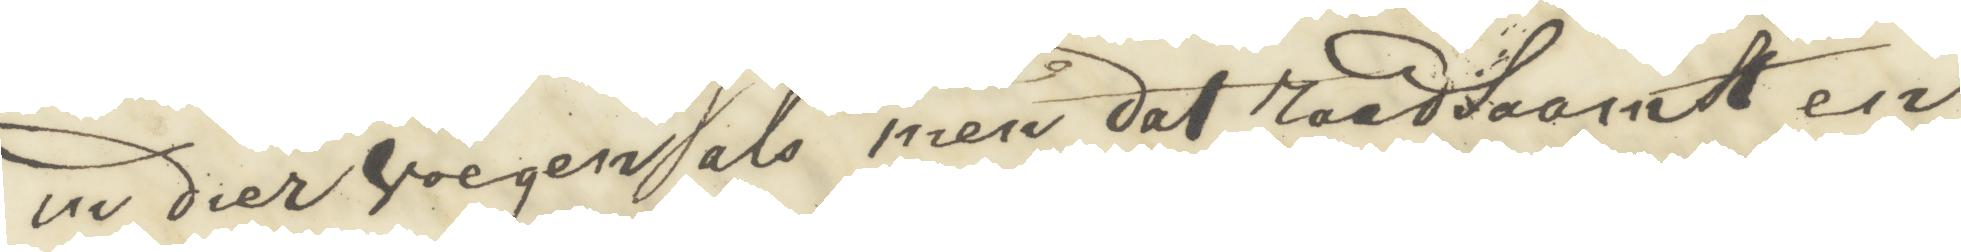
in dier voegen als men dat raadsaamst en
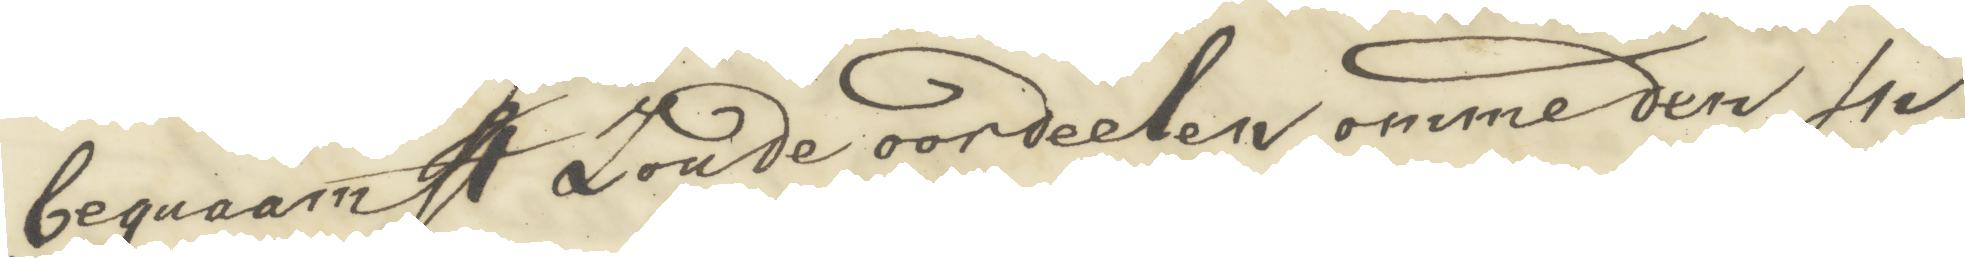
bequaamst zoude oordeelen omme den In
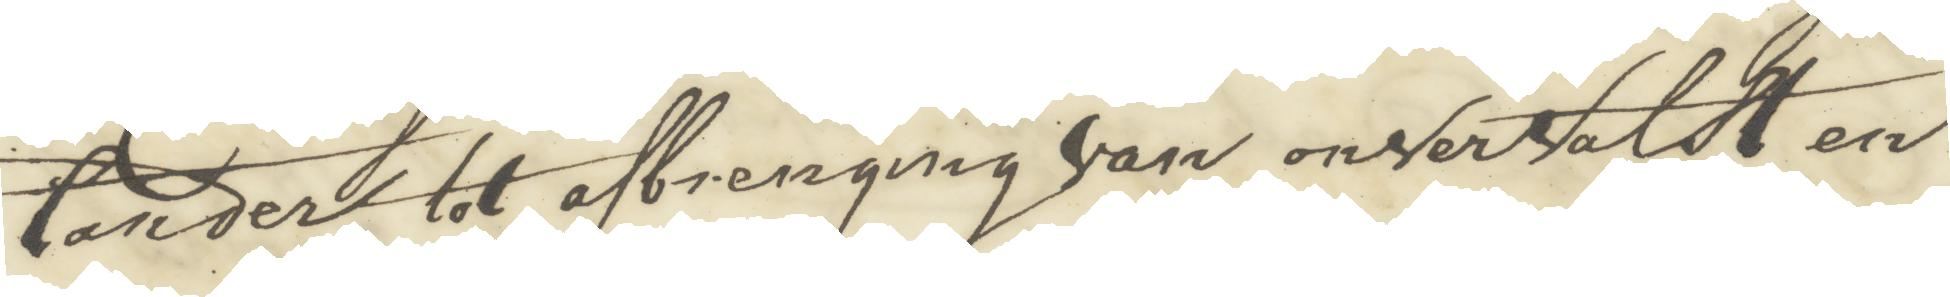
lander tot afbrenging van onvervalst en
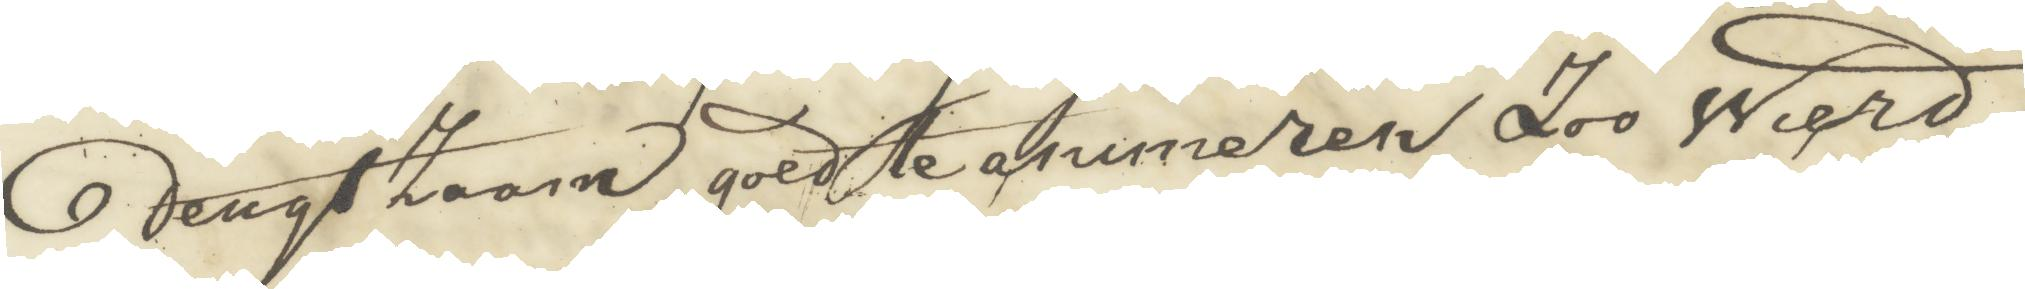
deugtzaam goed te animeren, zoo wierd
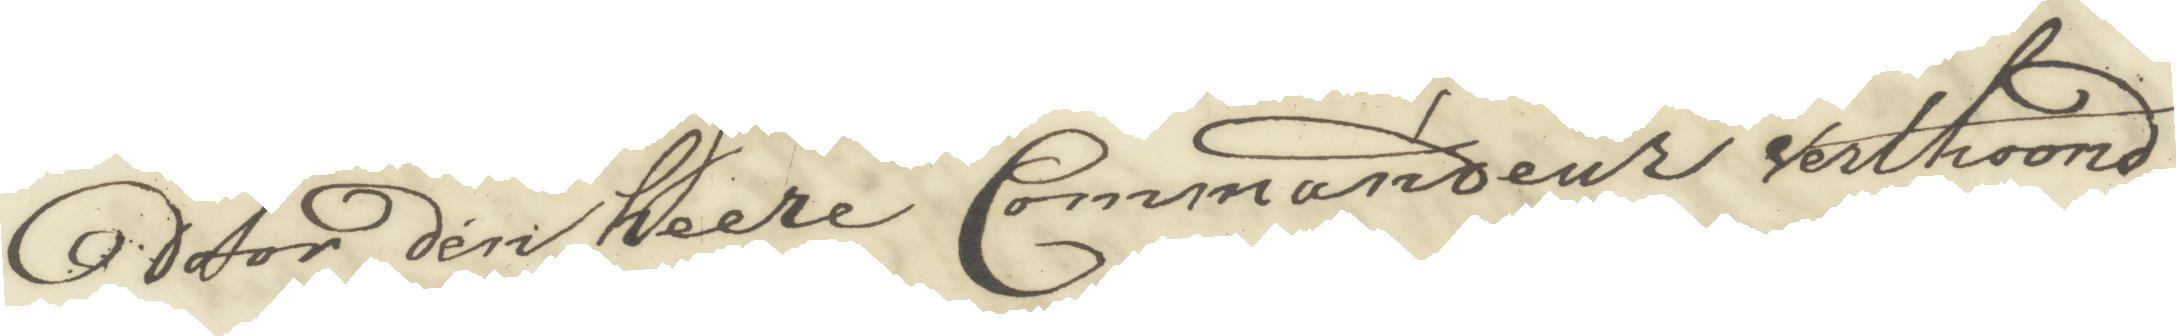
door den heere Commandeur verthoond
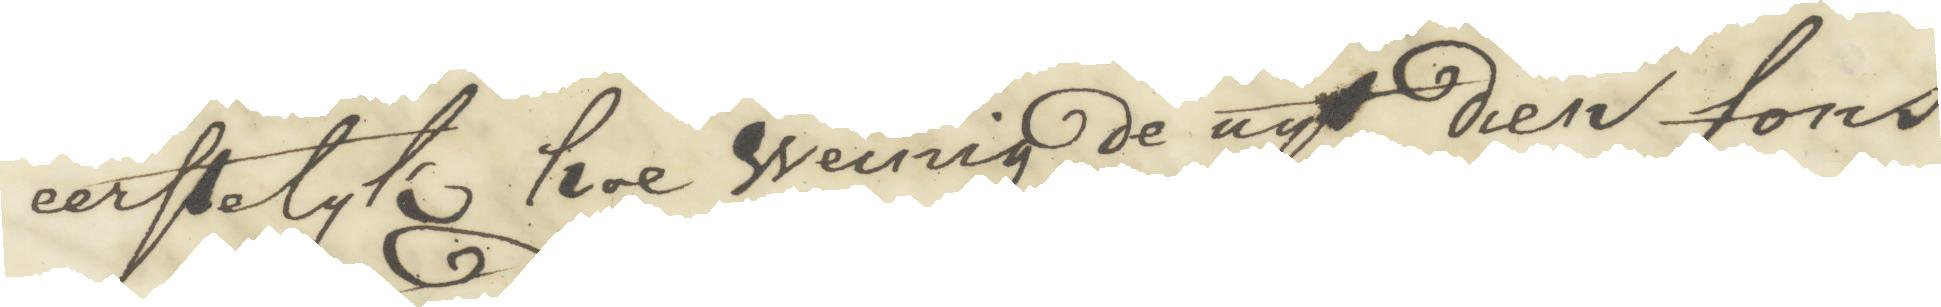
eerstelijk hoe weenig de uyt dien fons
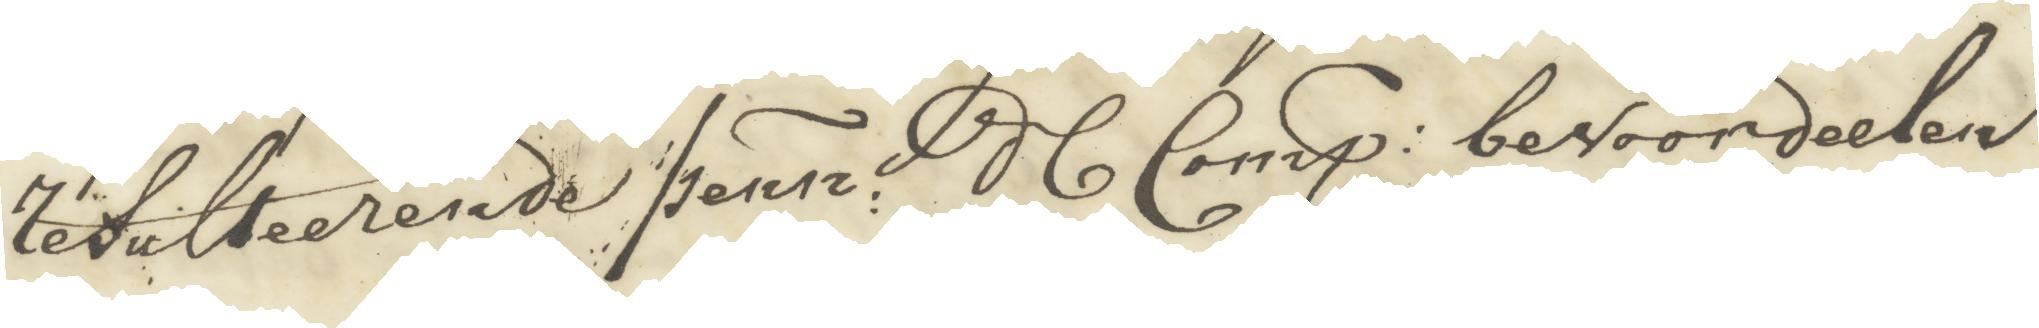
resulteerende penn: dE Comp: bevoordeelen
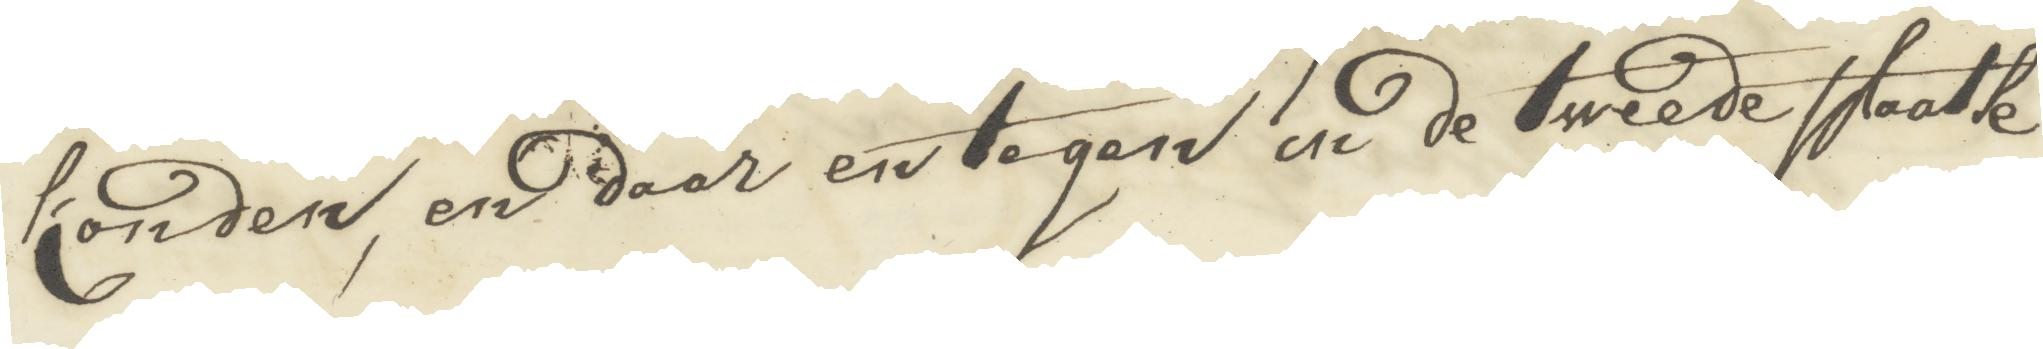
konden, en daar en tegen in de tweede plaatse
